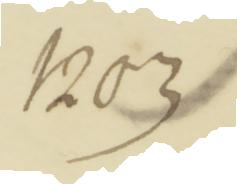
1203
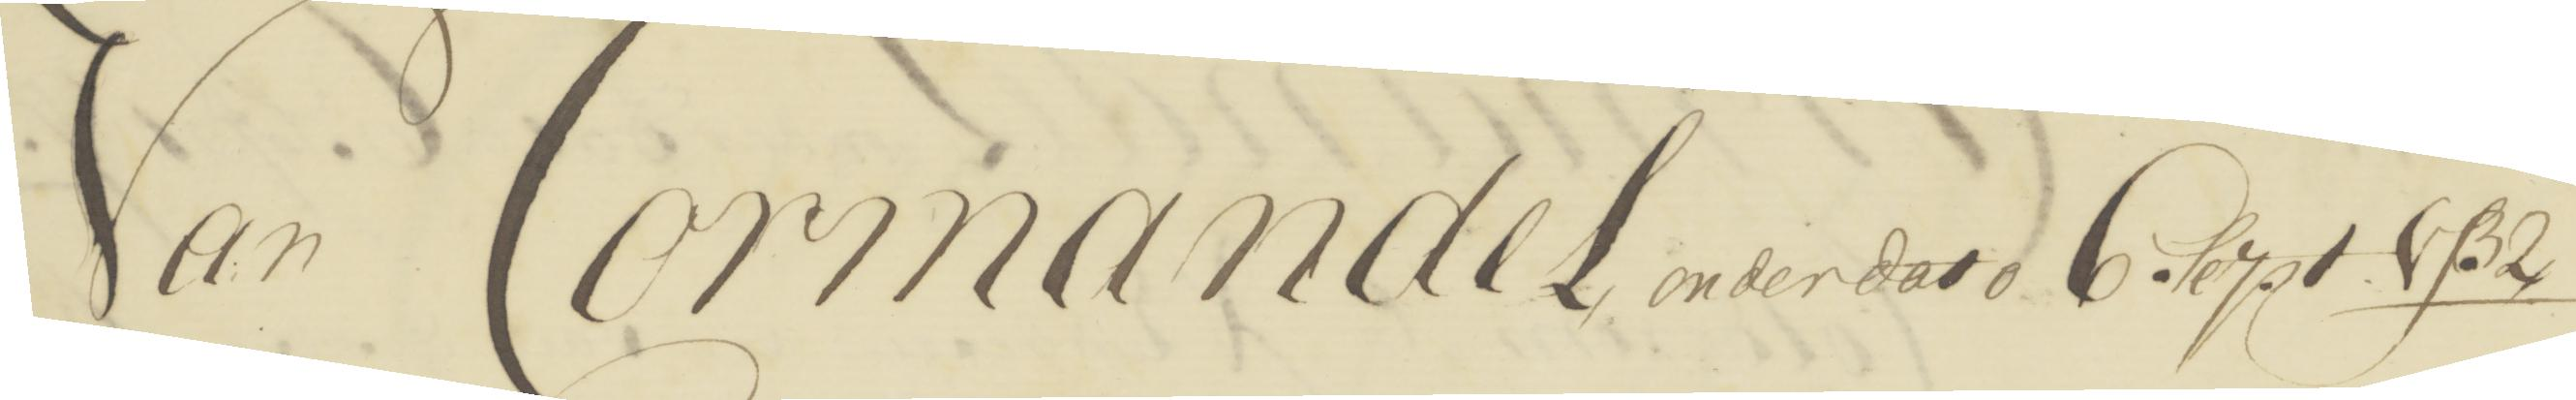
Van Cormandel, onder dato 6 Sept. 1732
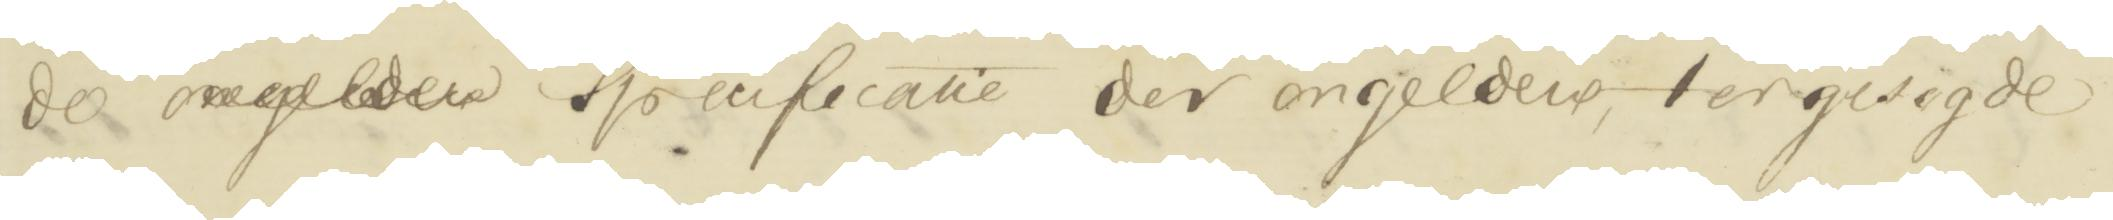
de ongelden specificatie der ongelden, ter gesegde
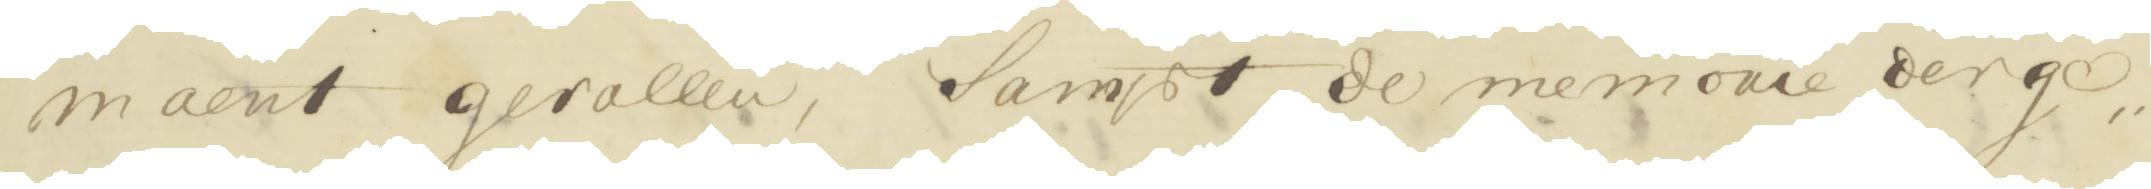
maent gevallen, sampt de memorie der ge„
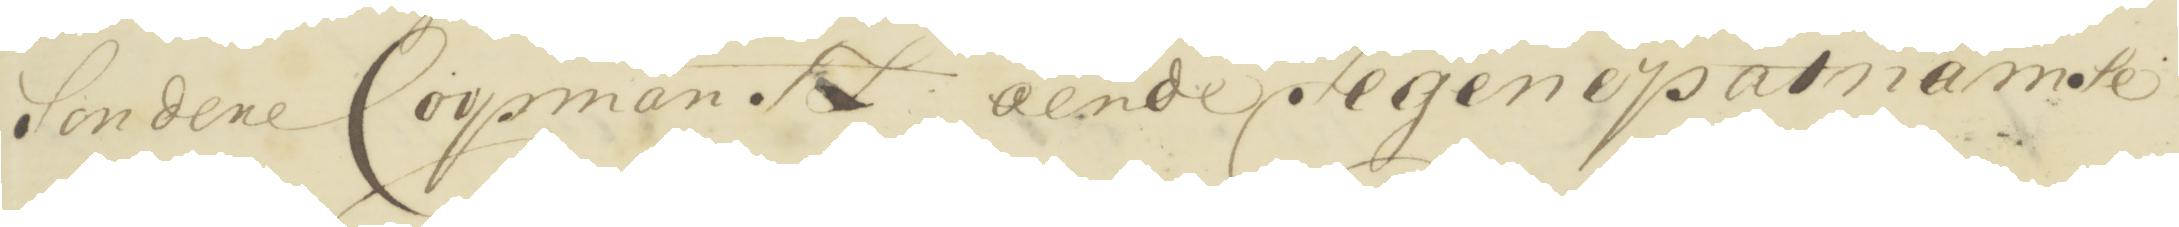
sondene Coopmansz aende Tegenepatnamse
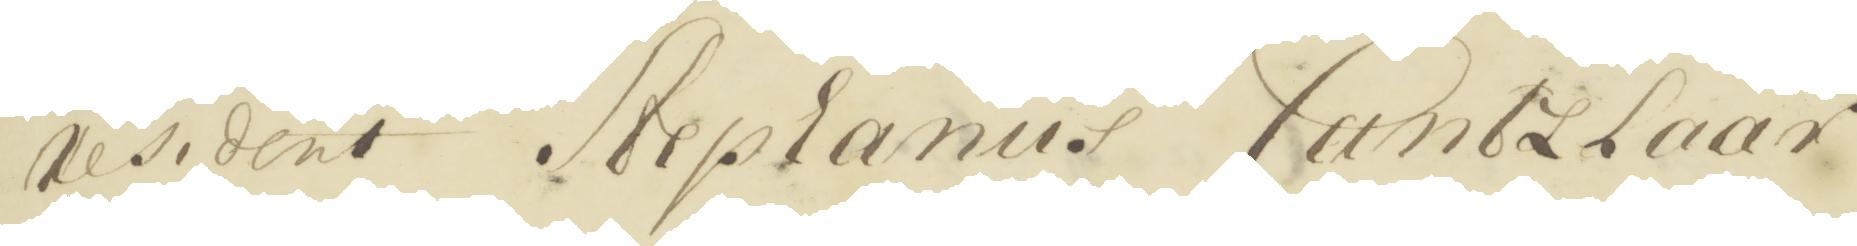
resident Stephanus Cantzlaar
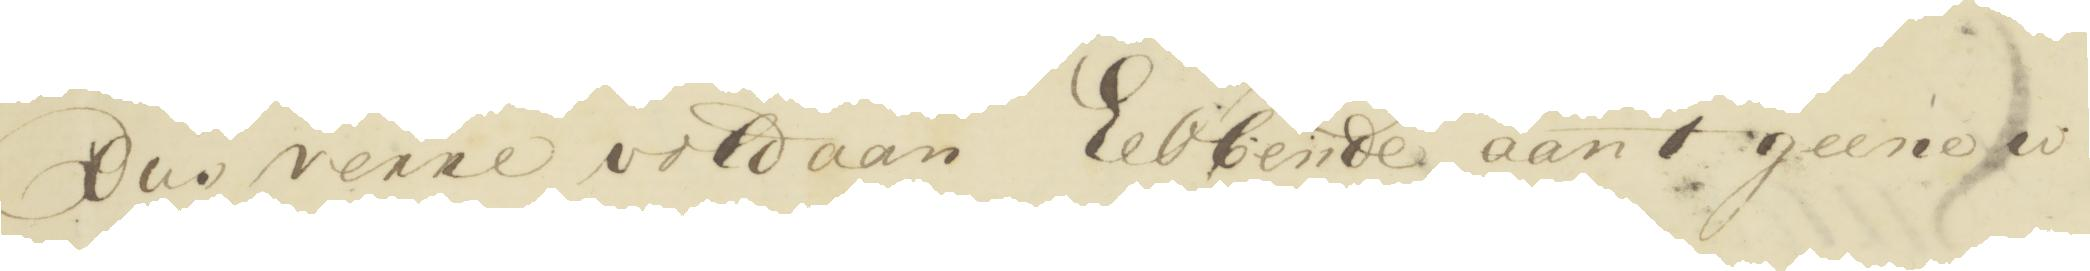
dus verre voldaan hebbende aan t geene w
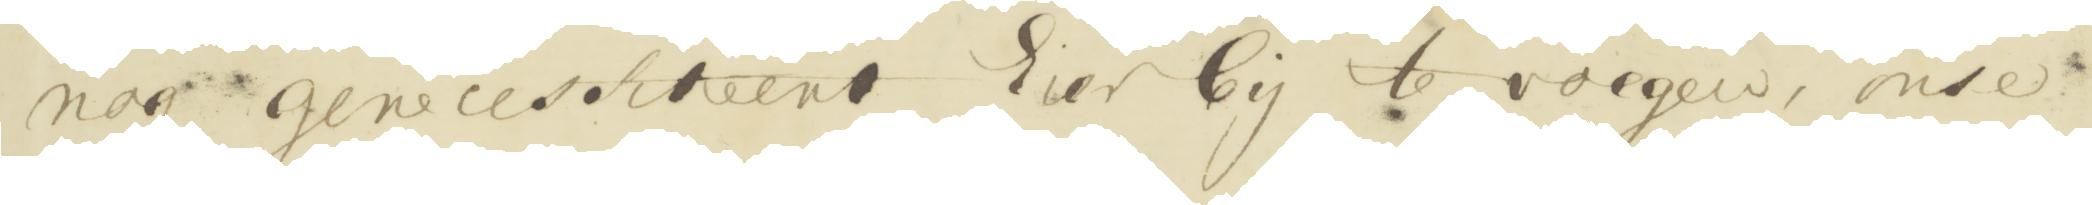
nog genecessiteert hier bij te voegen, onse
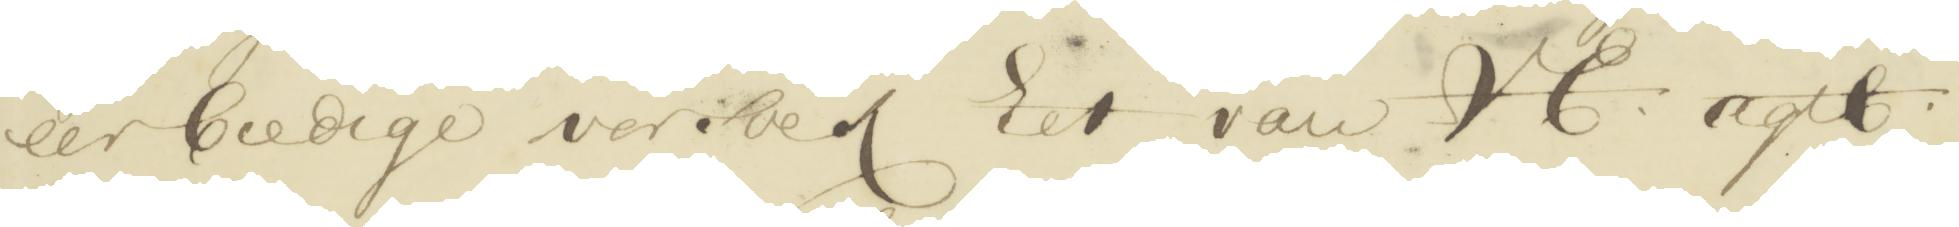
eerbiedige versoek het van VE: agtb:
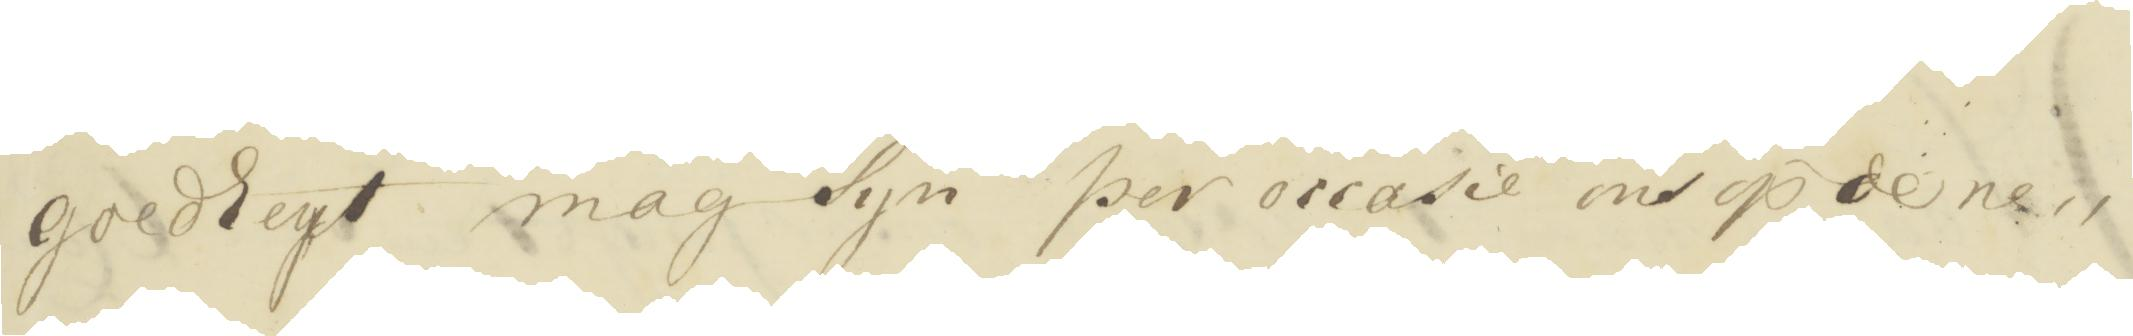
goedheyt mag syn per occasie ons op de ne„
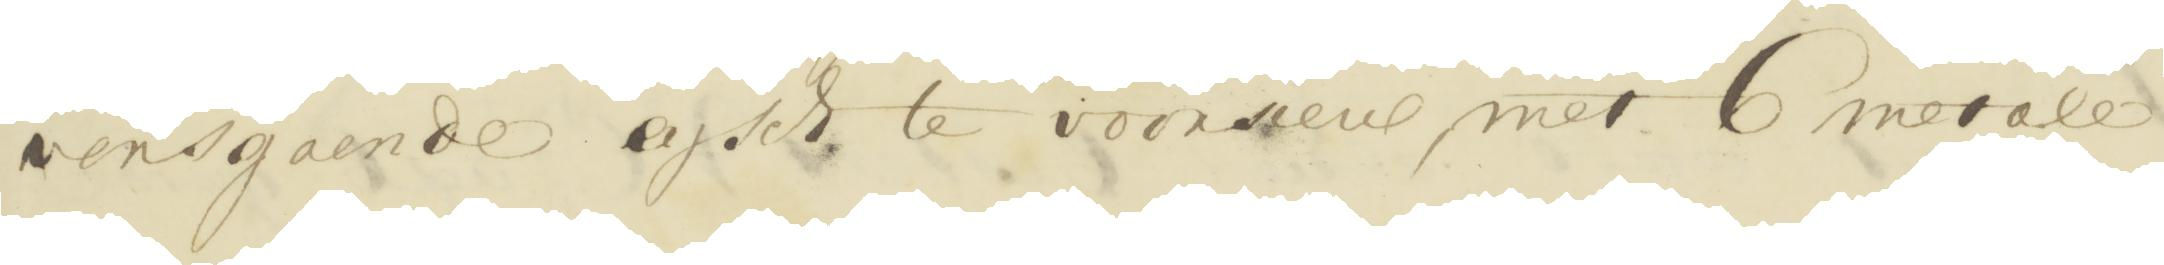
vensgaende eysch te voorsien met 6 metale
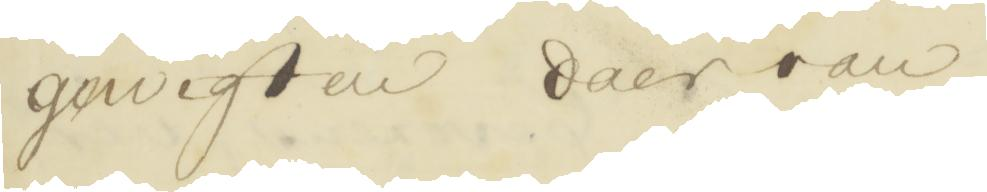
gewigten daer van
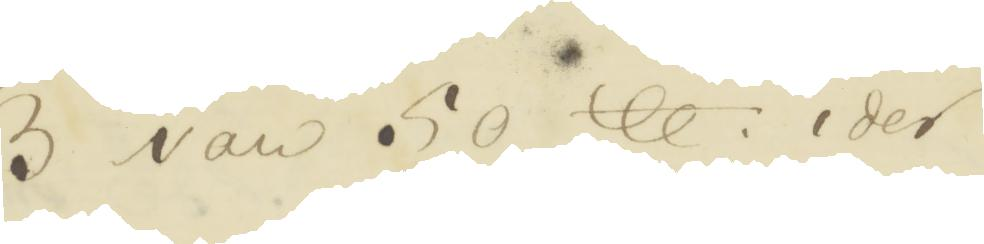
3 van 50 lb: ider
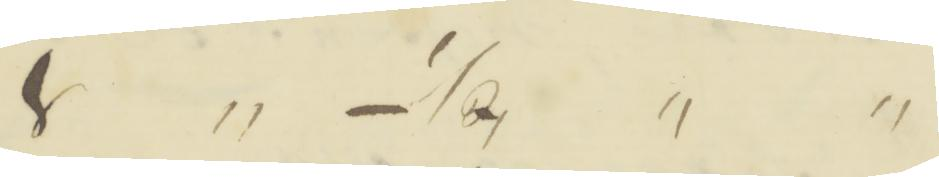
1 „ —½ „ „
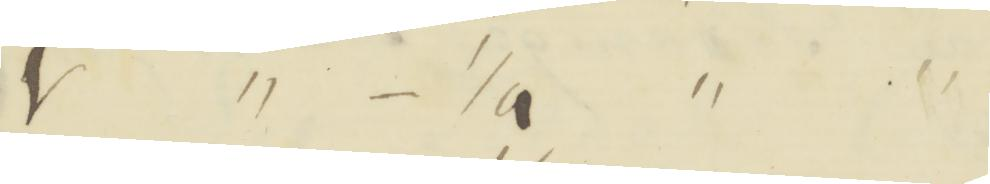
1 „ — ¼ „ „
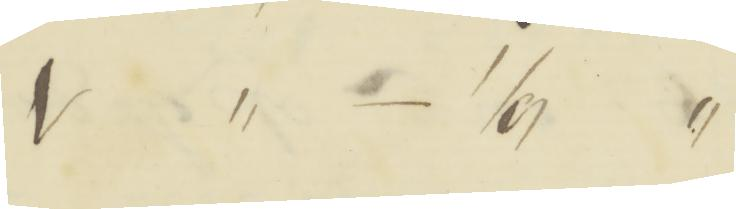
1 „ — 1/9
